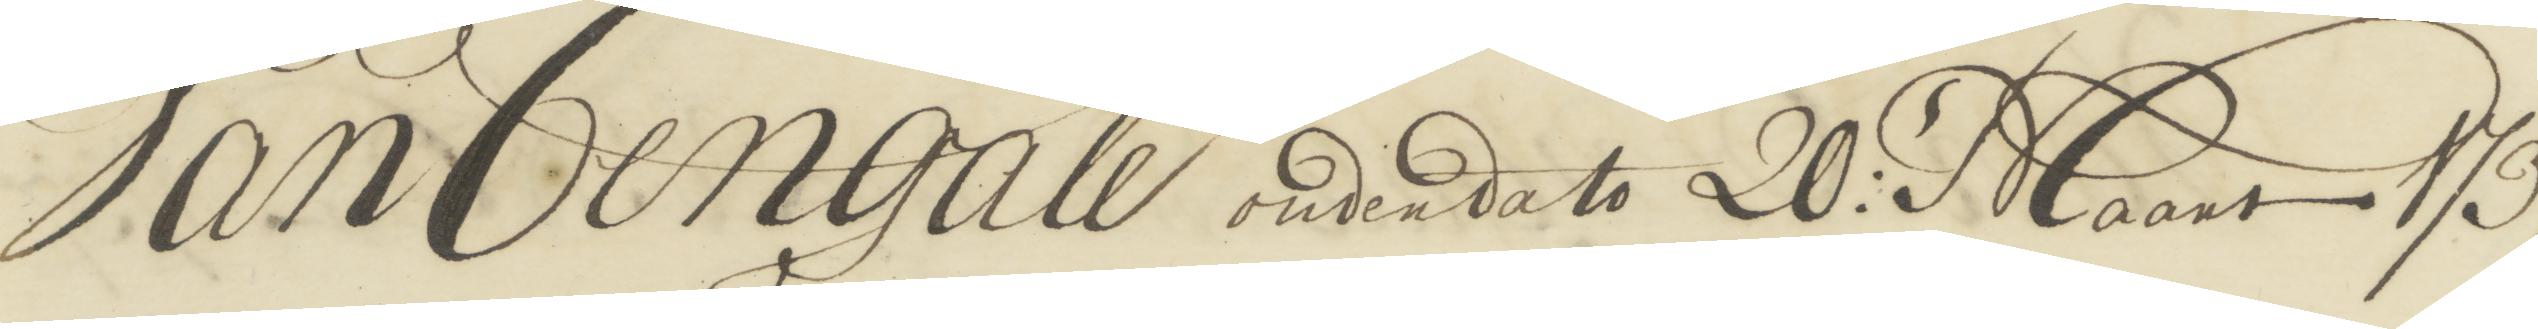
Van Bengale onder dato 20:' Maart 1737
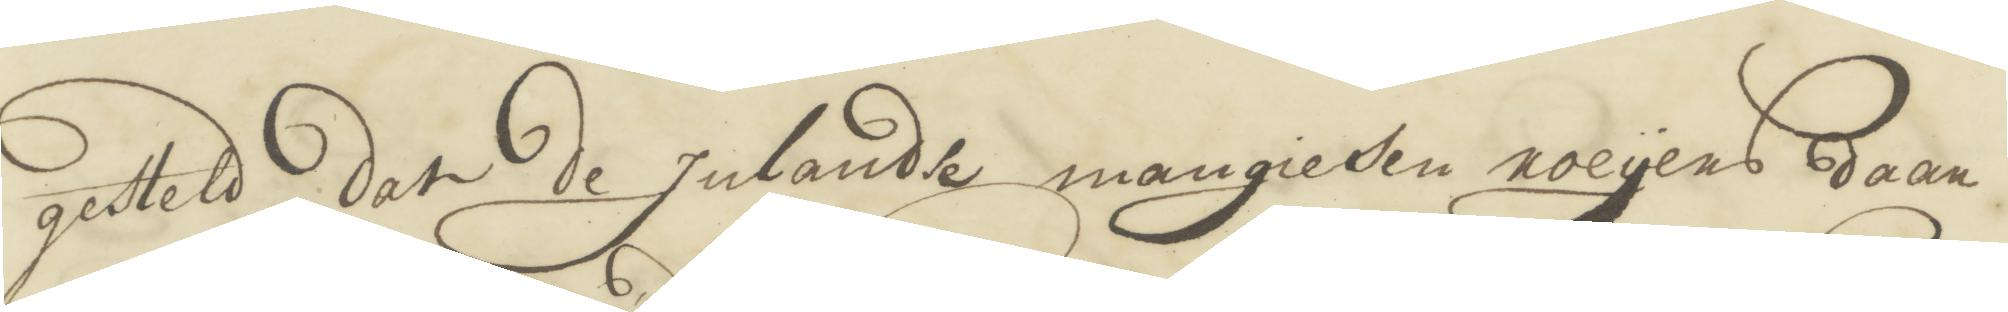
gesteld dat de Jnlandse mangiesen roeijers daar
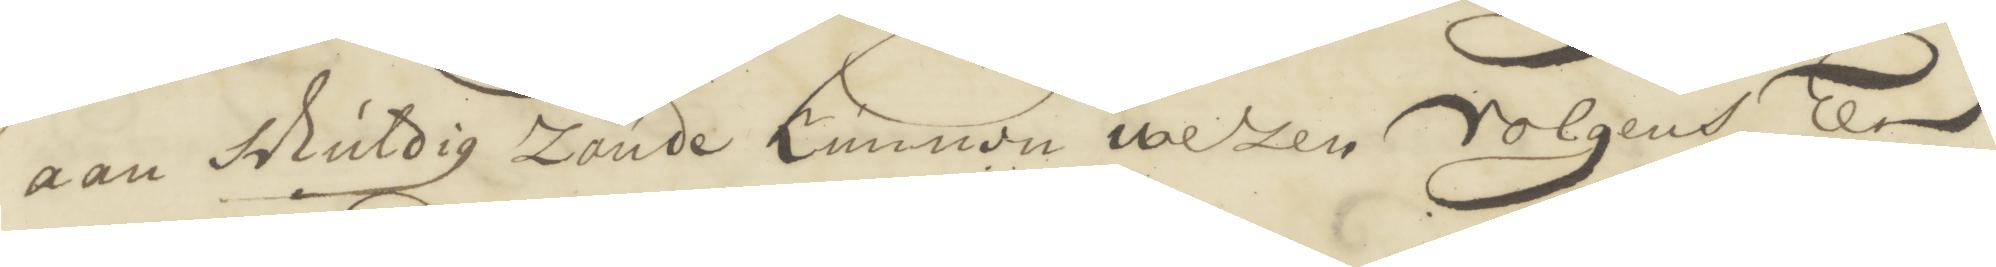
aan schuldig zoude kunnen wezen volgens het
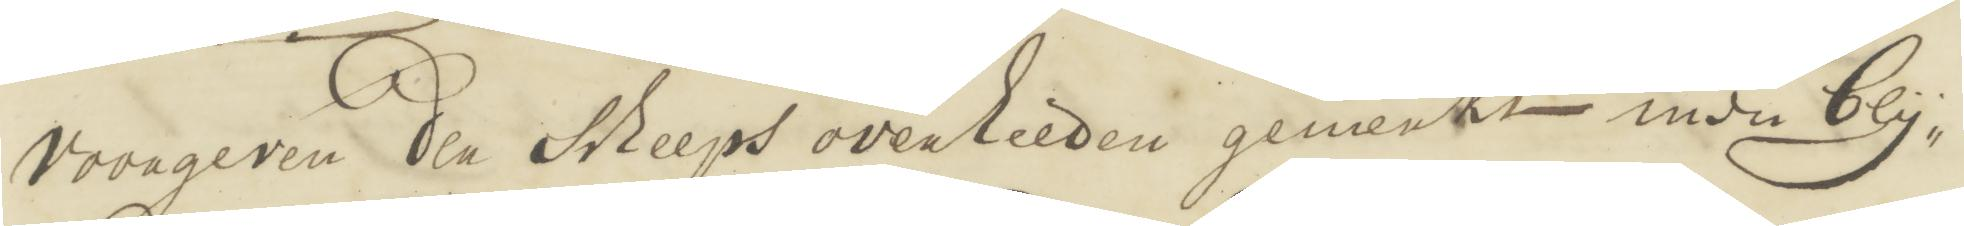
voorgeven der scheeps overheeden gemerkt men blij„
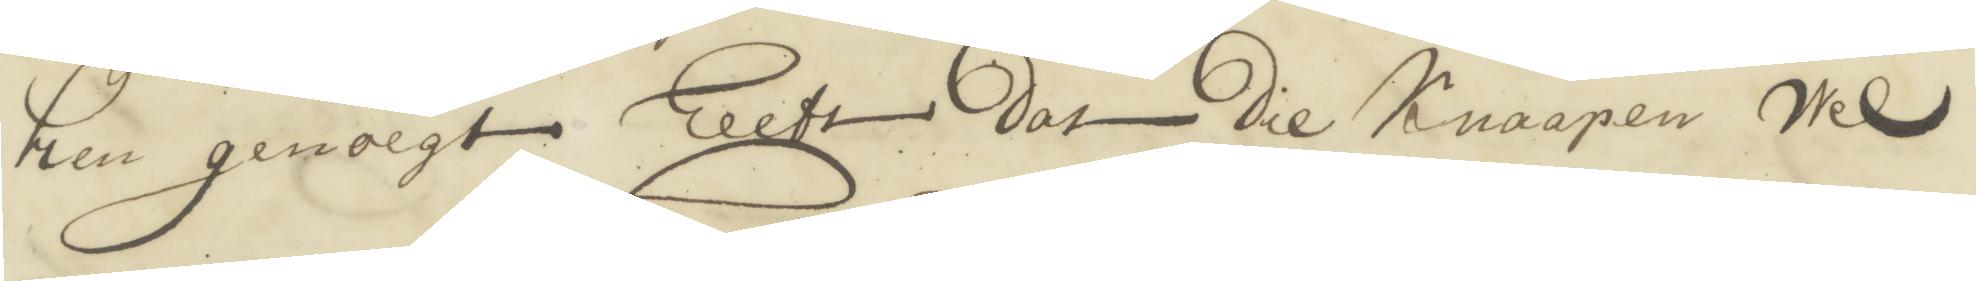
ken genoegt heeft dat die knaapen wel
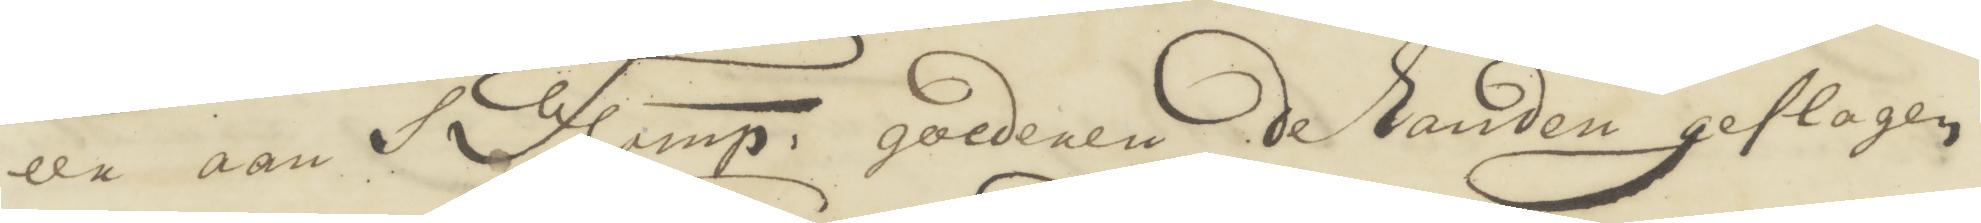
eer aan s EComp: goederen, de handen geslagen
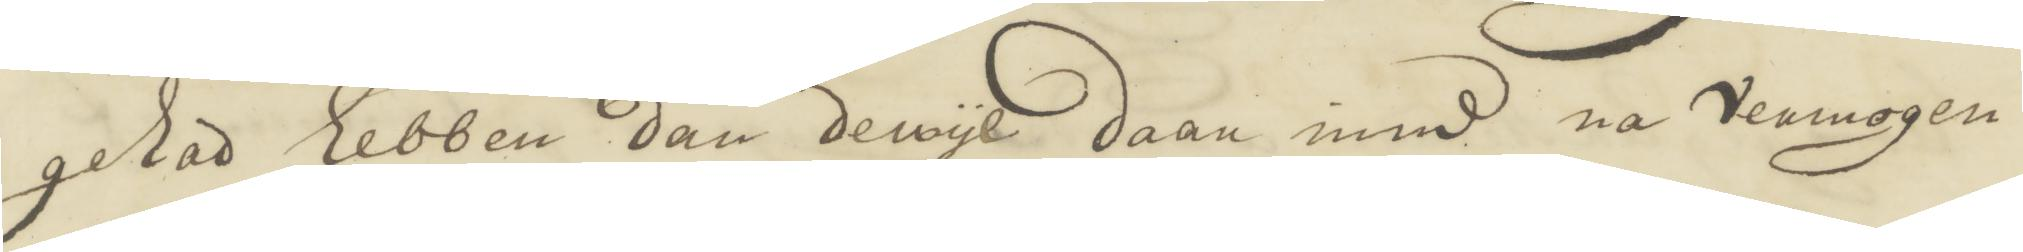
gehad hebben dan dewijl daar inne na vermogen
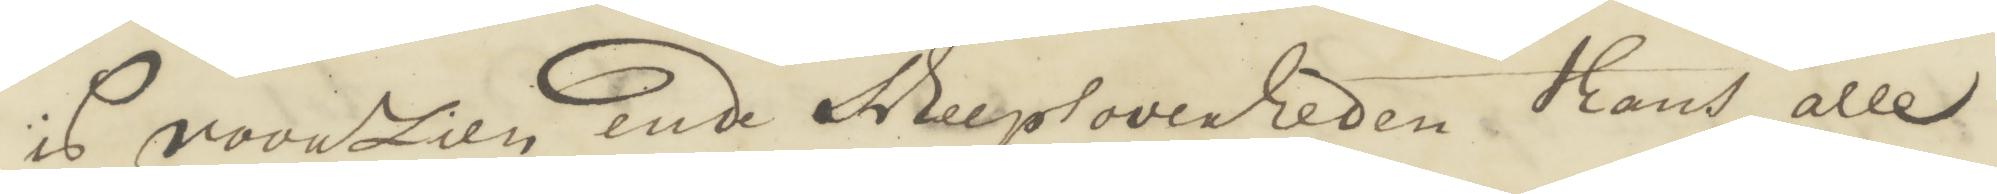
is voorzien ende scheeps overheden thans alle
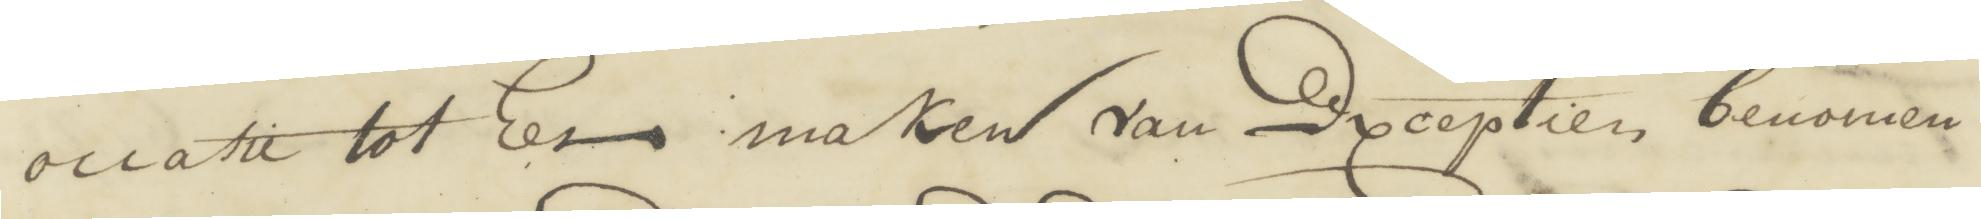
occatie tot het maken van Exceptien benomen
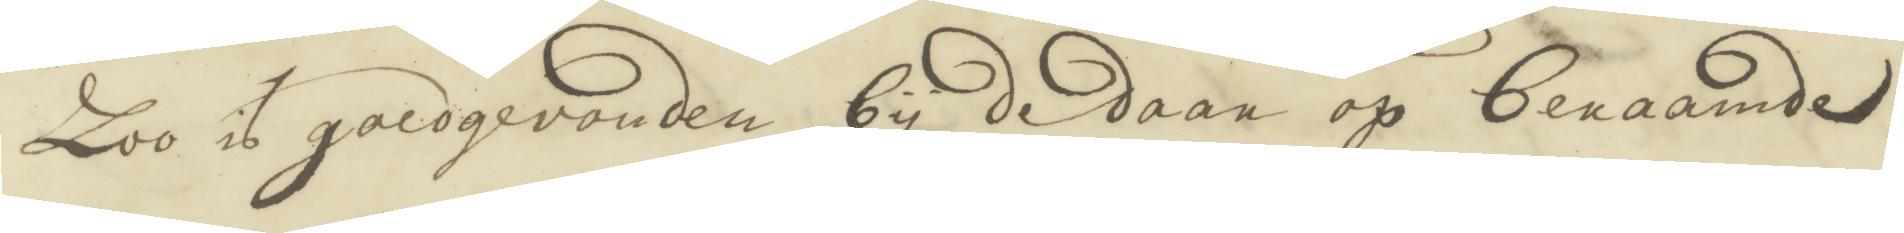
zoo is goedgevonden bij de daar op beraamde
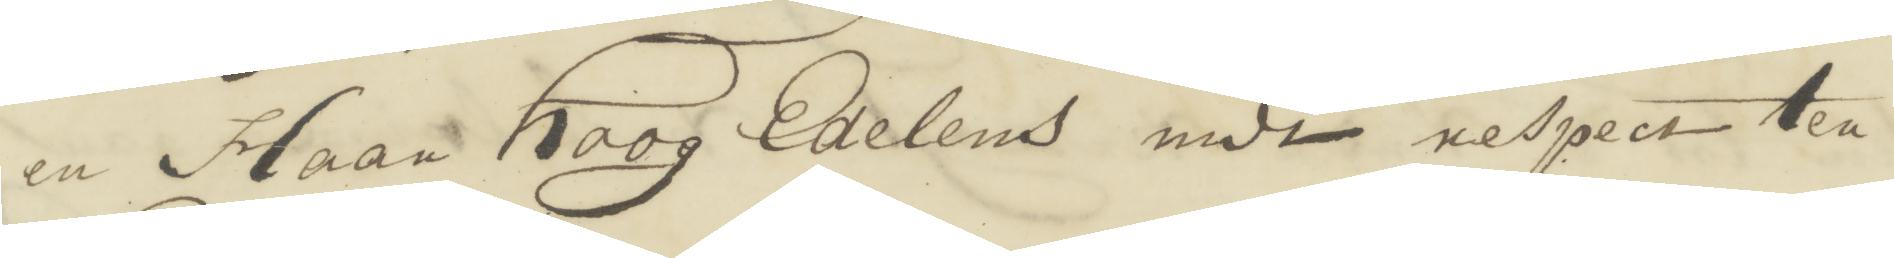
en Haar hoog Edelens met respect ter
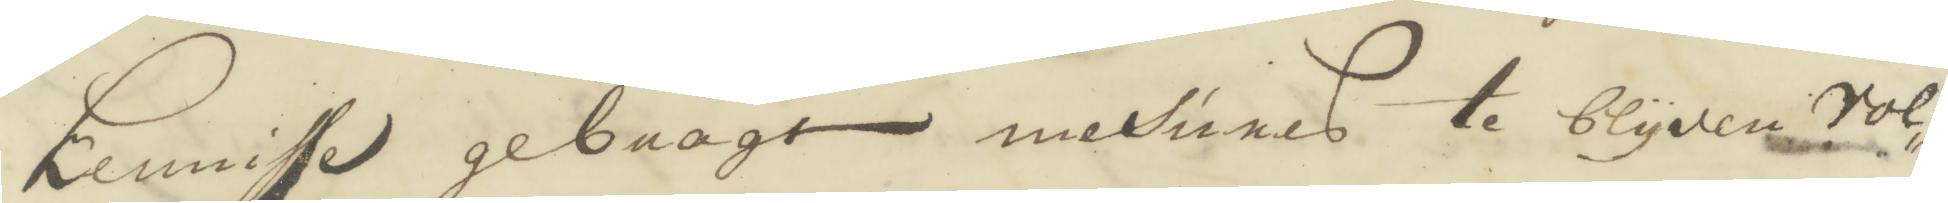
kennisse gebragt mesures te blijven vol„
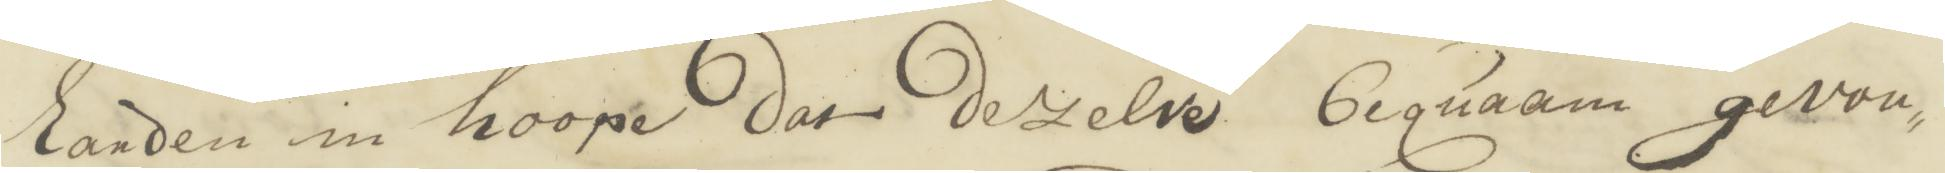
harden in hoope dat dezelve bequaam gevon„
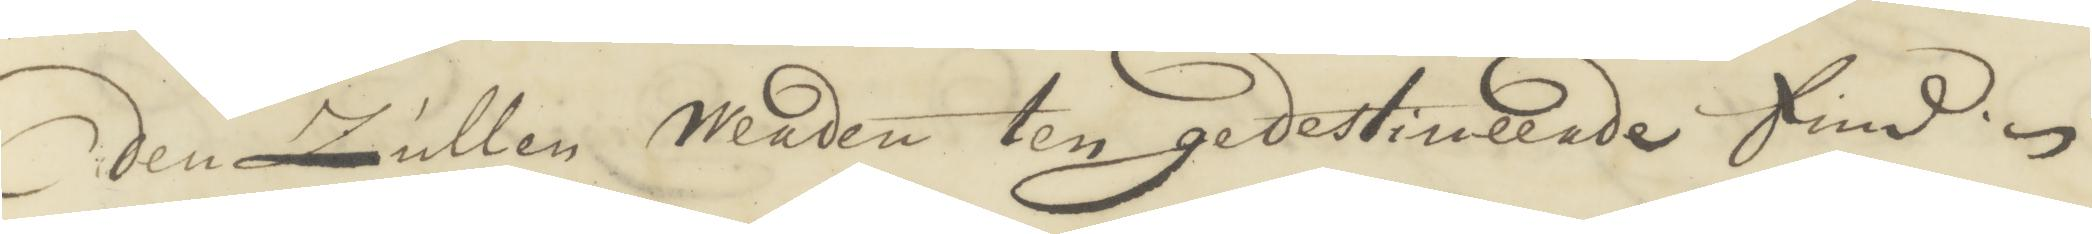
den zullen werden ten gedestineerde fine.
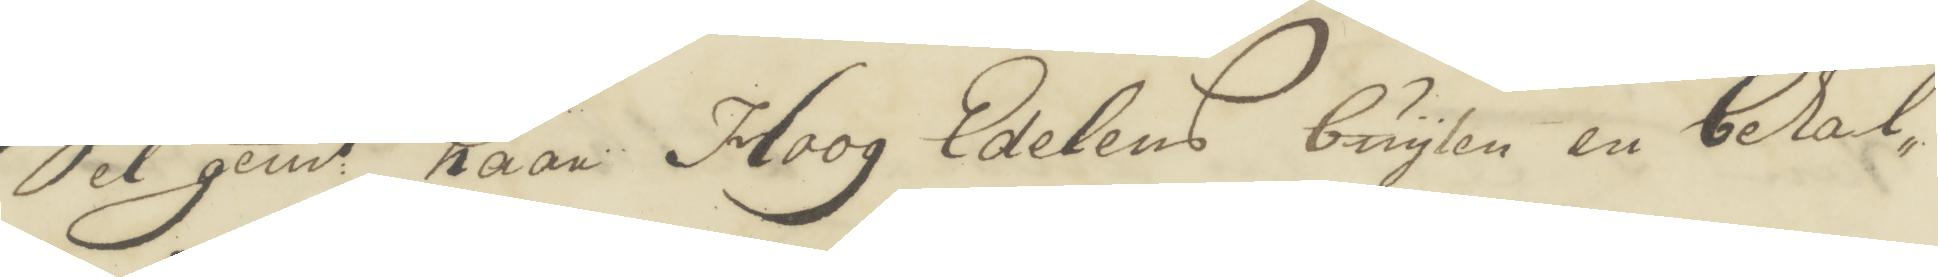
Wel gem:t haar Hoog Edelens buijten en behal„
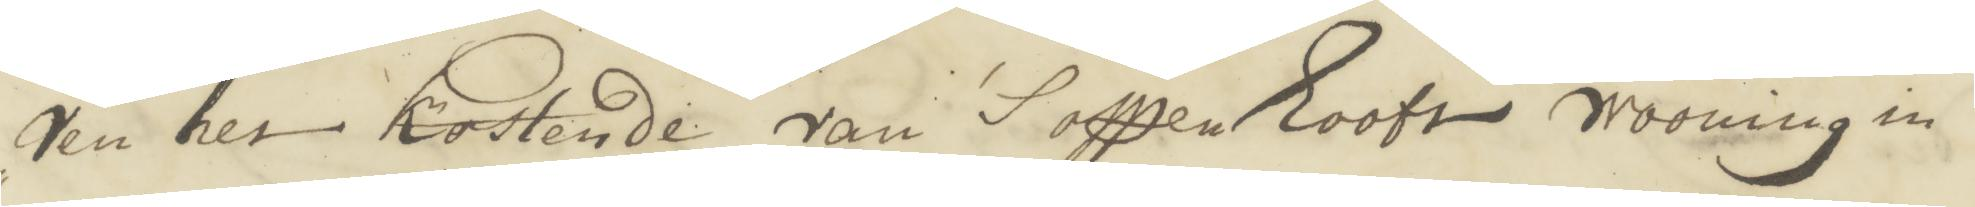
„ven het kostende van ’s opperhooft wooning in
